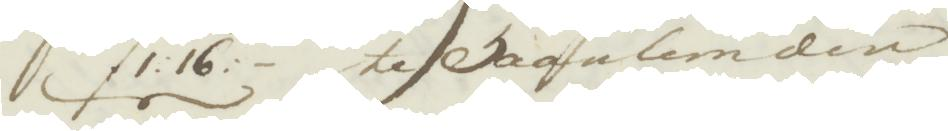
ƒ 1:16: - te Haarlem den
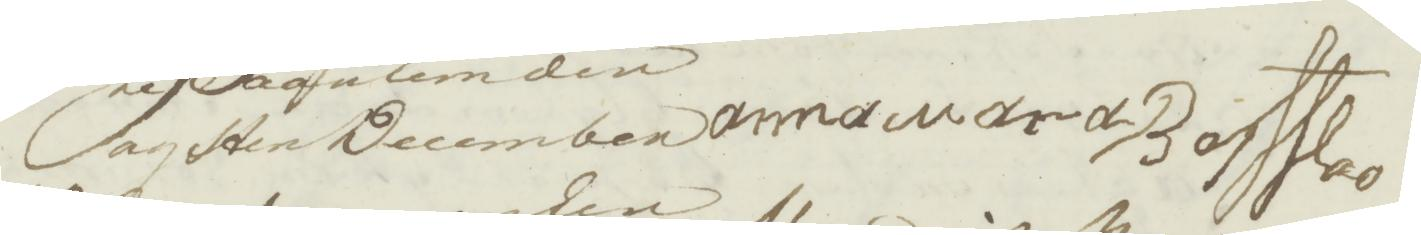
agsten December anna mara Berffloo
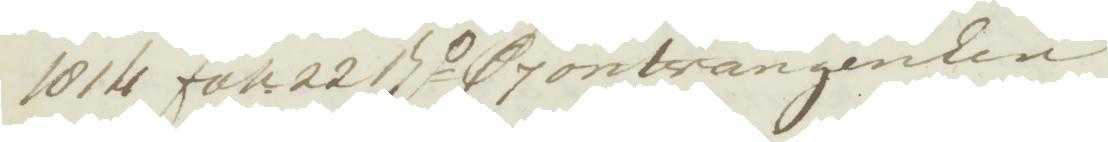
1814 fol.o 22 N=o C 7 ontvangen Een
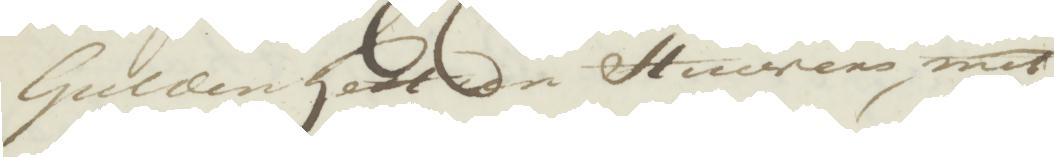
Gulden zestien Stuivers, met
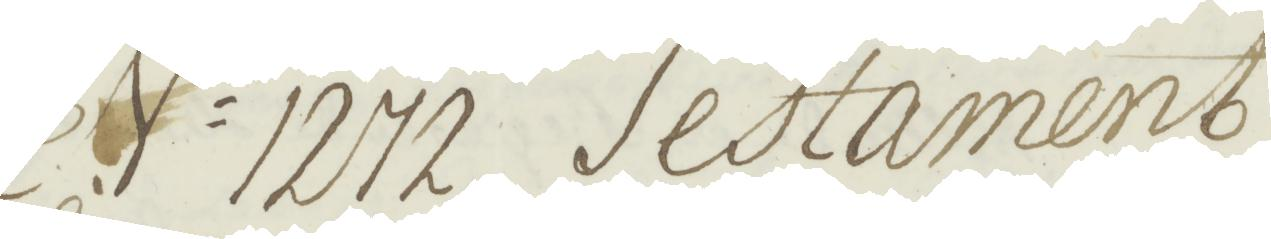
N= 1272. Testament
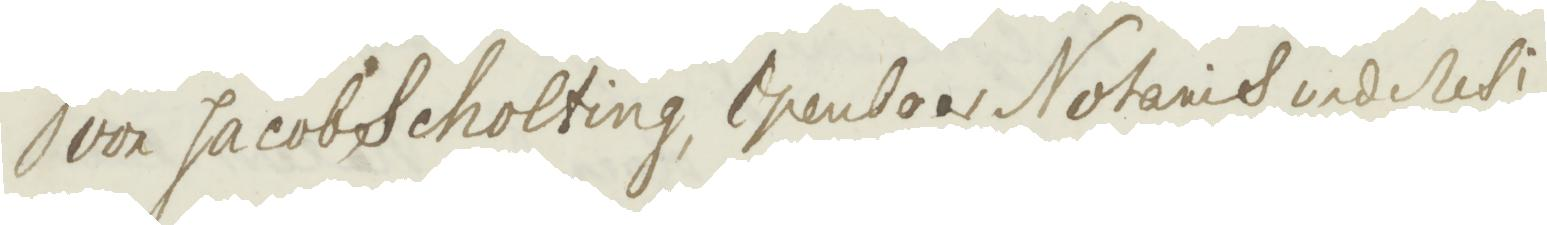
Voor Jacob Scholting, Openbaar Notaris, in dee resi
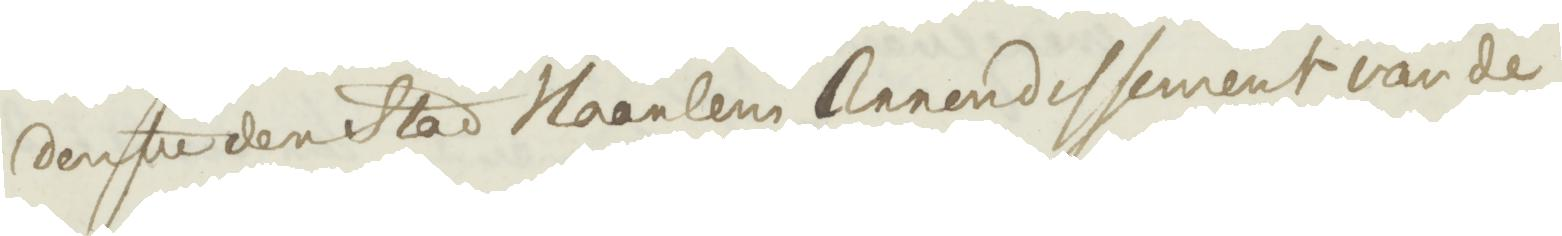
dentie den Stad Haarlem, Arrendissement van de
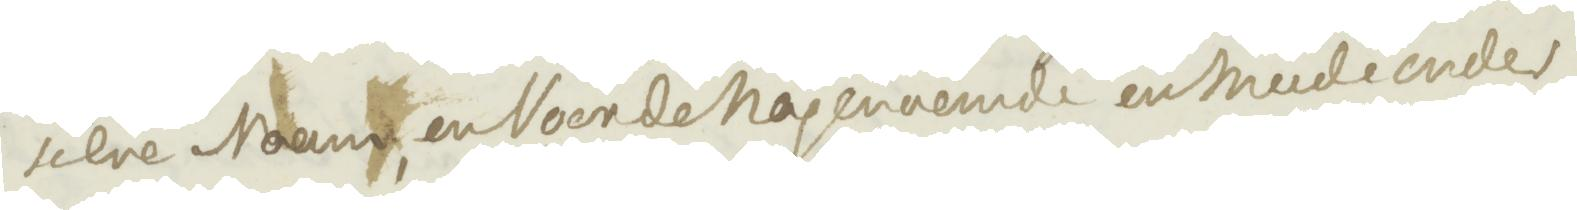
selve Naam, en Voor de nagenoemde en meede onder
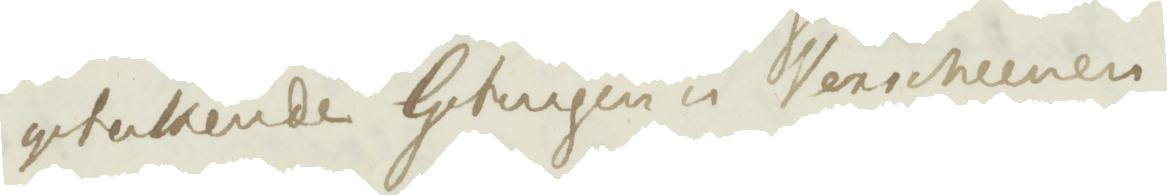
geteekende Getuigen is Verscheenen
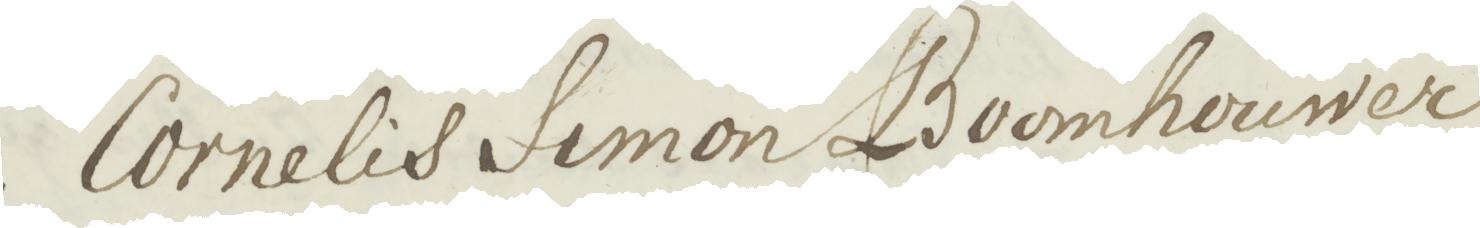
Cornelis Simon Boomhouwer
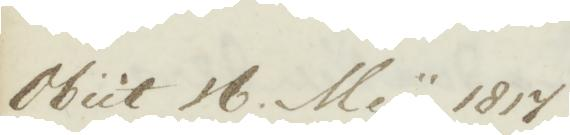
Obiit 16. Meij 1817.
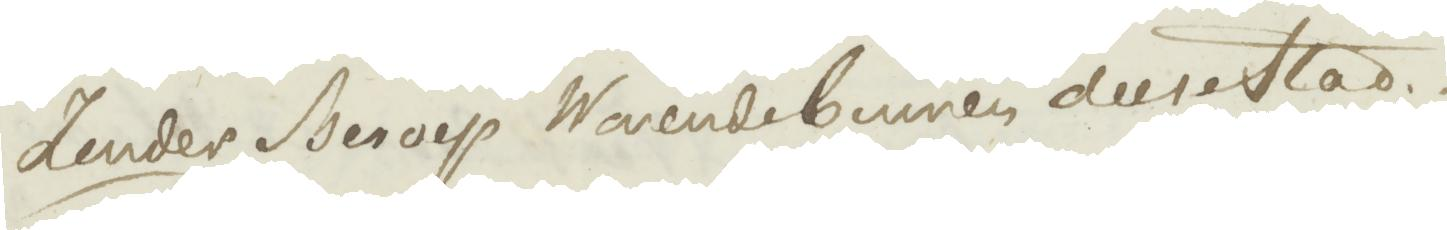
Zonder Beroep Warende binnen deese stad.
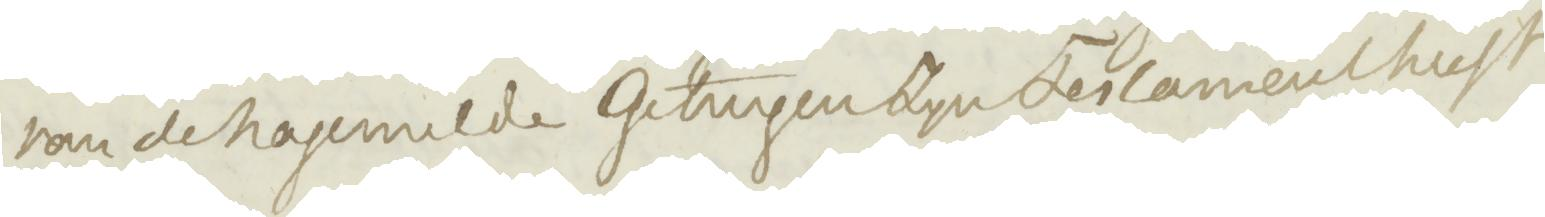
van de nagemelde getuigen zijn Testament heeft
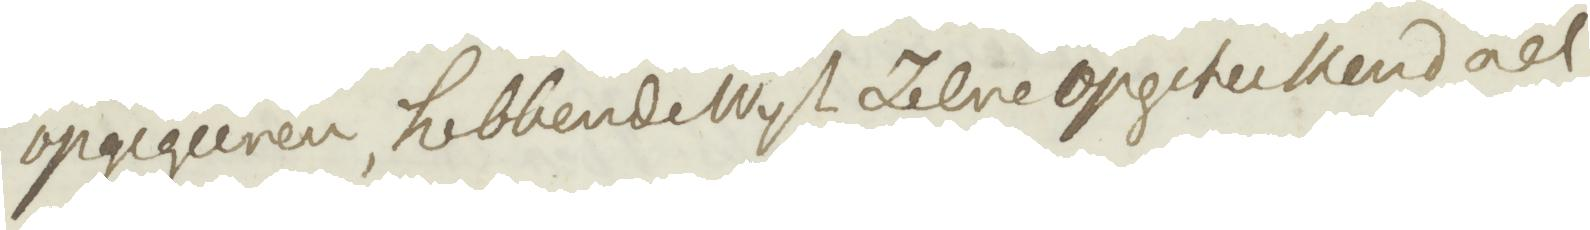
opgegeeven, hebbende wyt zelve opgeteekend als
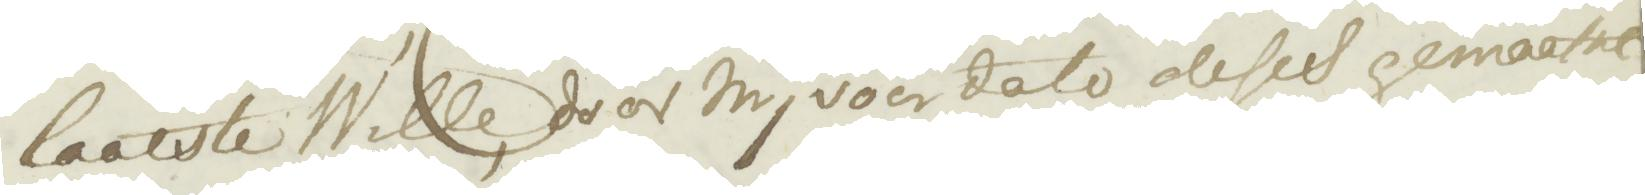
laatste Wille, door mij voor dato deses gemaakt
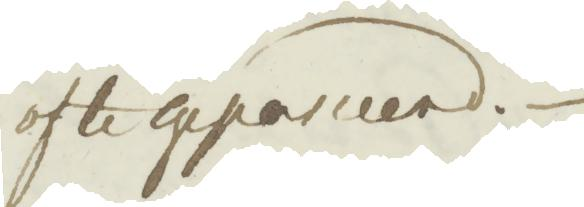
of te gepasseerd. -
